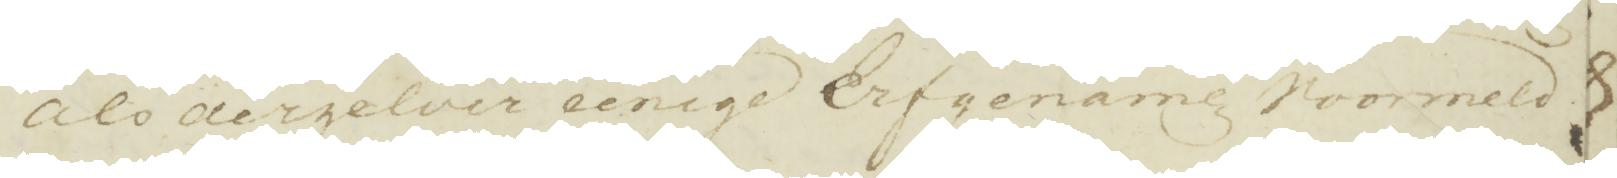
als derzelver eenige Erfgenamen voormeld.
